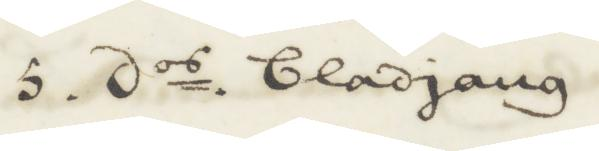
5. d=os. bladjang
